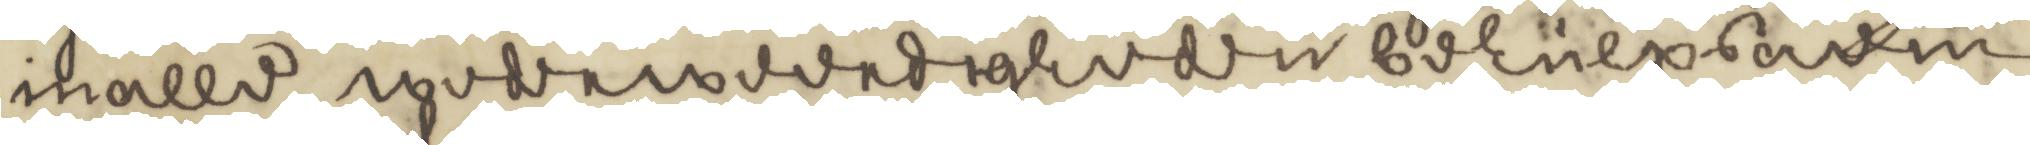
in alle wederweerdigheden behulpsaem
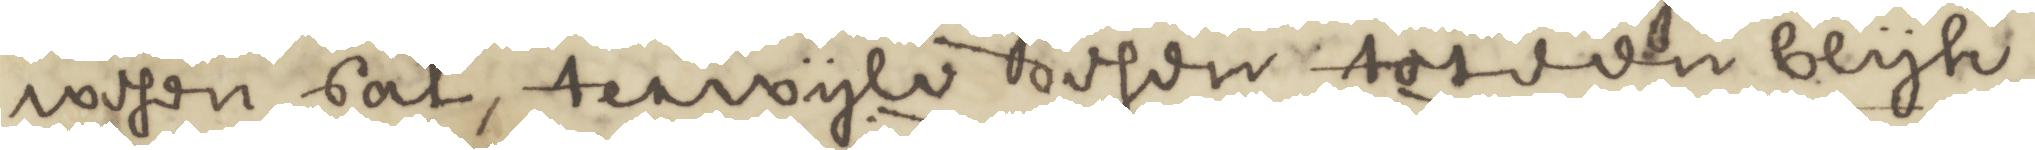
wesen sal, terwijle desen tot een blijk
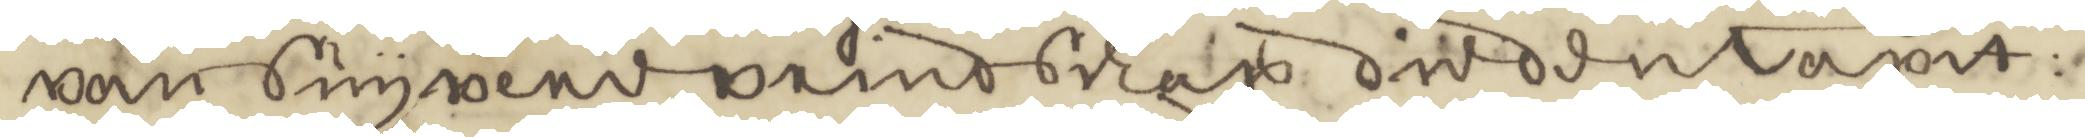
van suijvere vrindschap die den Capit:
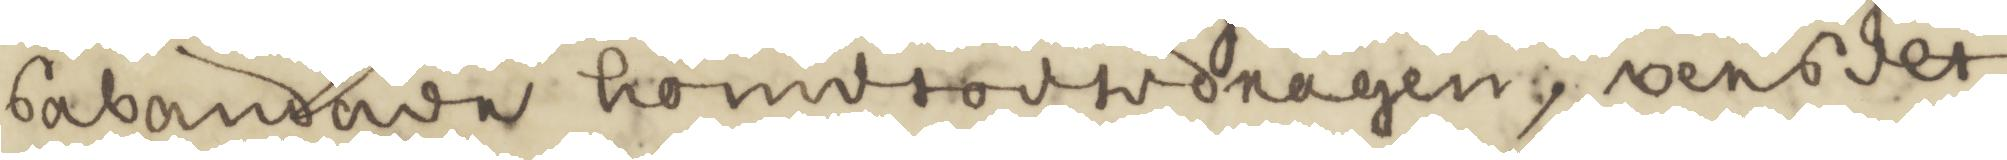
sabandaer kome toe tedragen; verselt
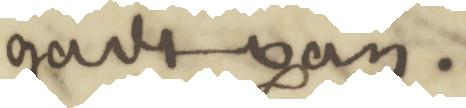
gaet van.
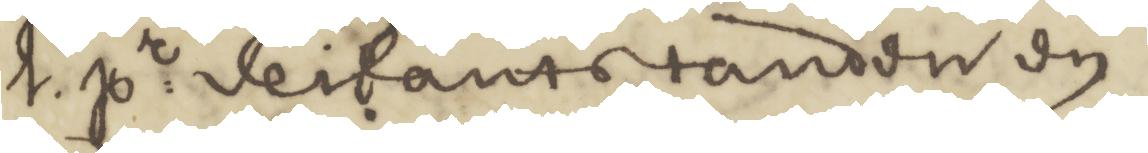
1. p:r Elifantstanden en
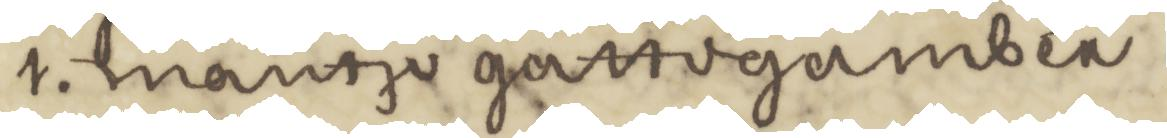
1. mantje gattegamber
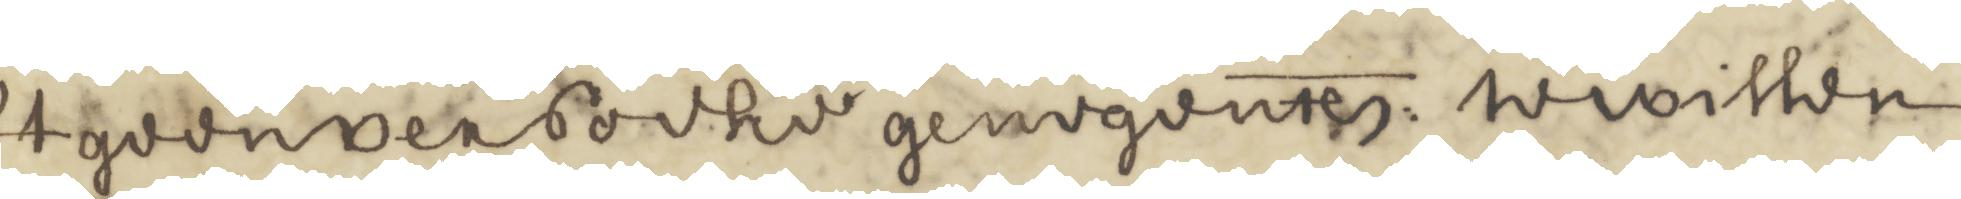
’t geen versoeke genegentlijk tewillen
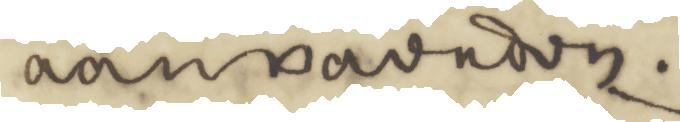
aanvaerden.
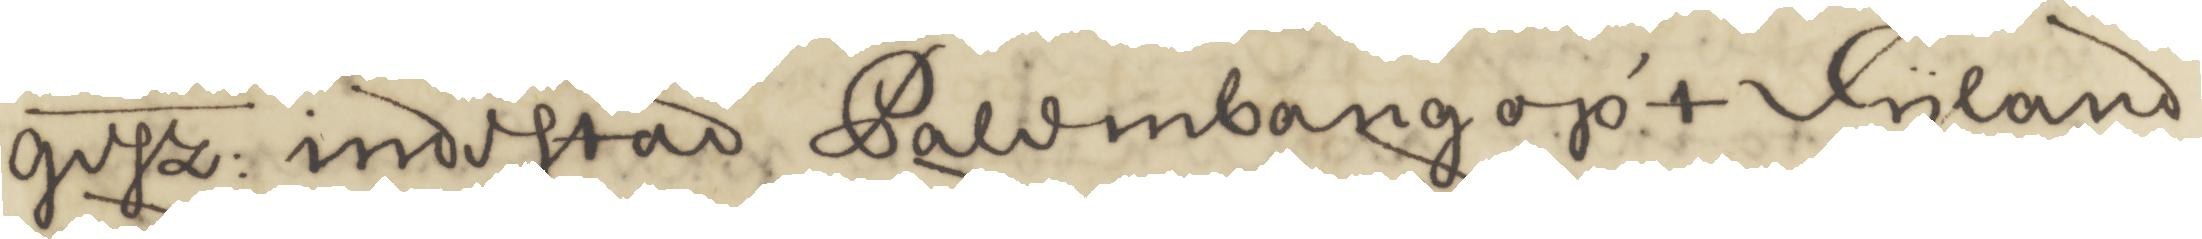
gesz: indestad Palembang op ’t Eijland
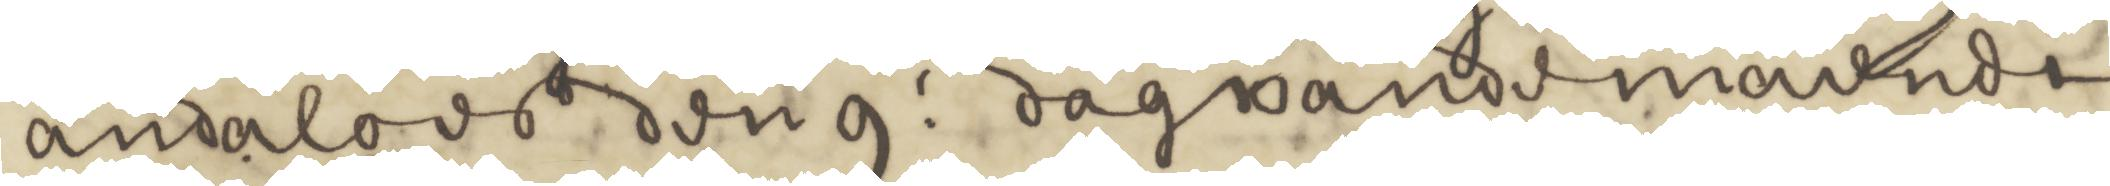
andaloes den 9:' dag vande maendt
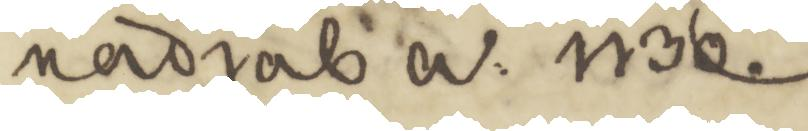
radjab a:o 1130.
